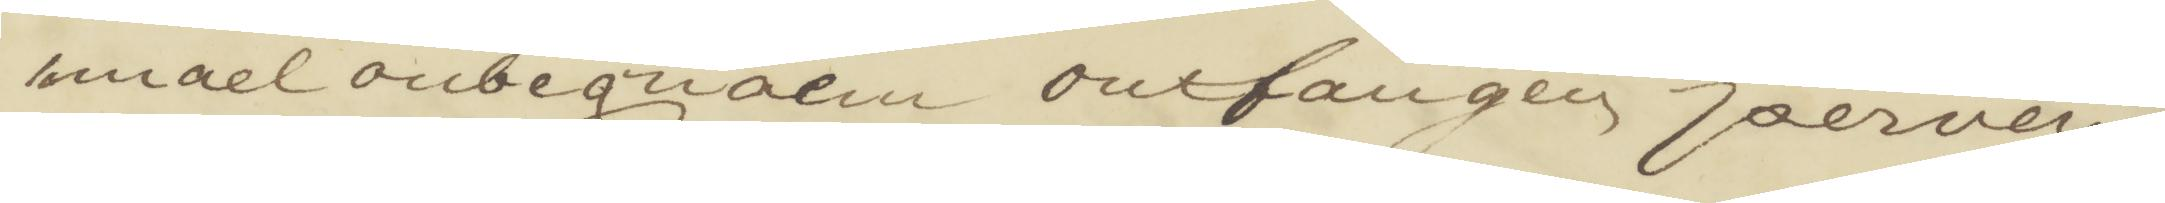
mael onbequaem ontfangen per ven„
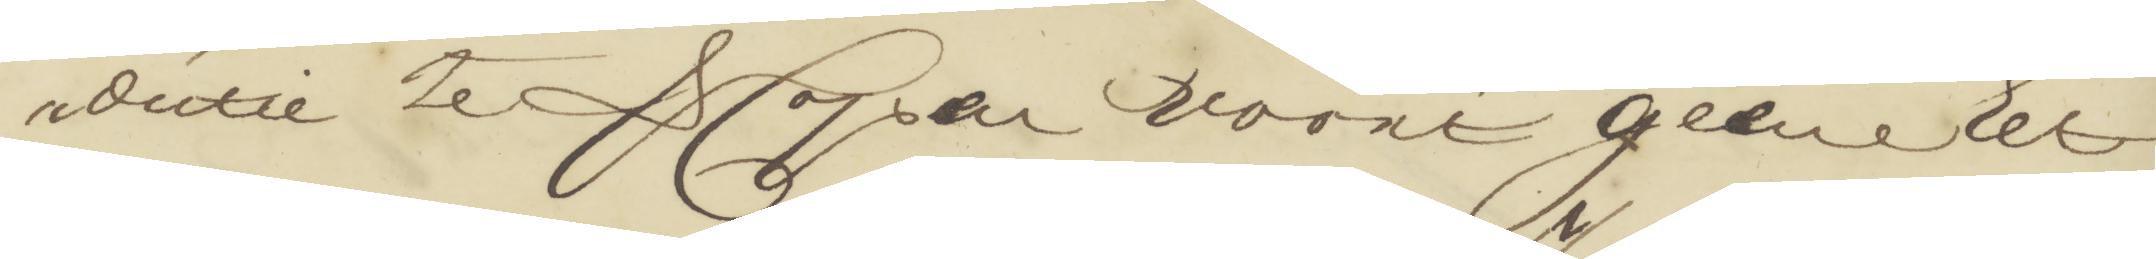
dutie tevercopen voor't geene het
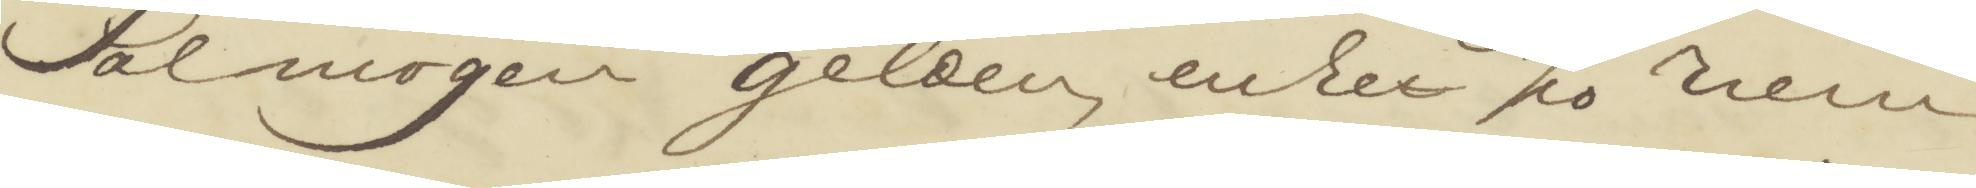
Sal mogen gelden en het 1/10 riem
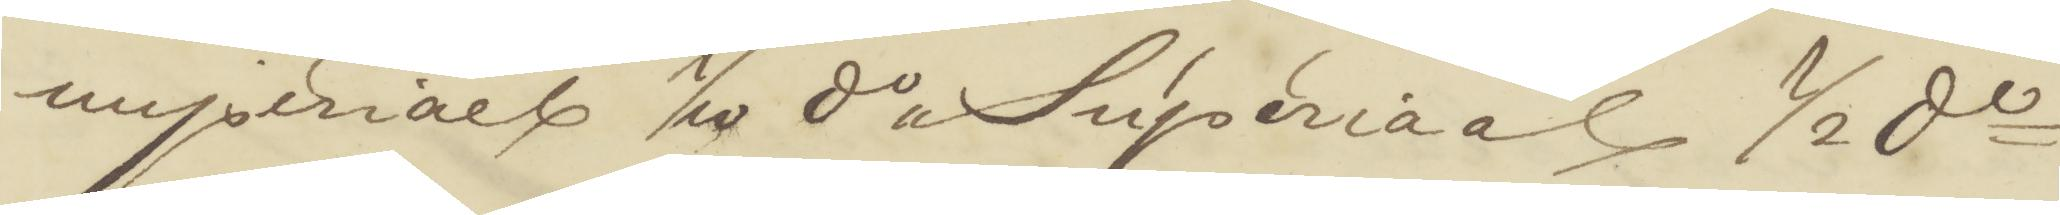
imperiael 1/10 d„o Superiaal ½ d=o
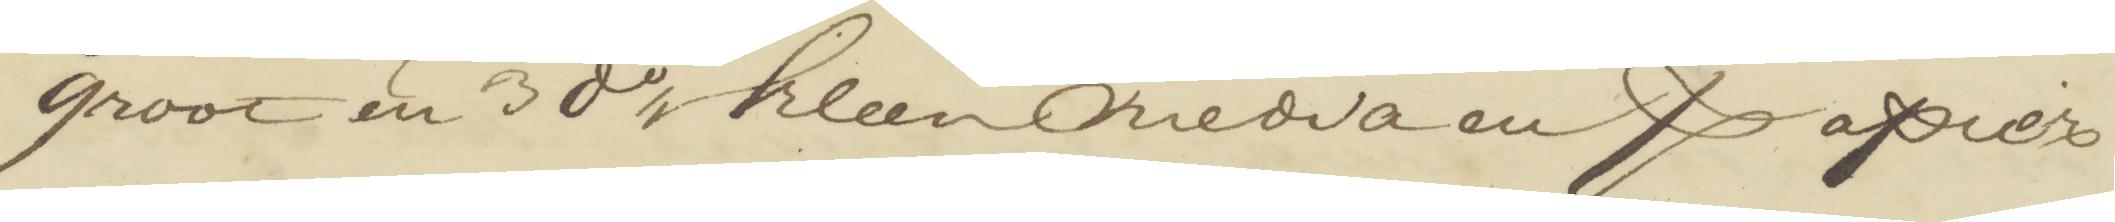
groot en 3 d„o kleen mede aen papier
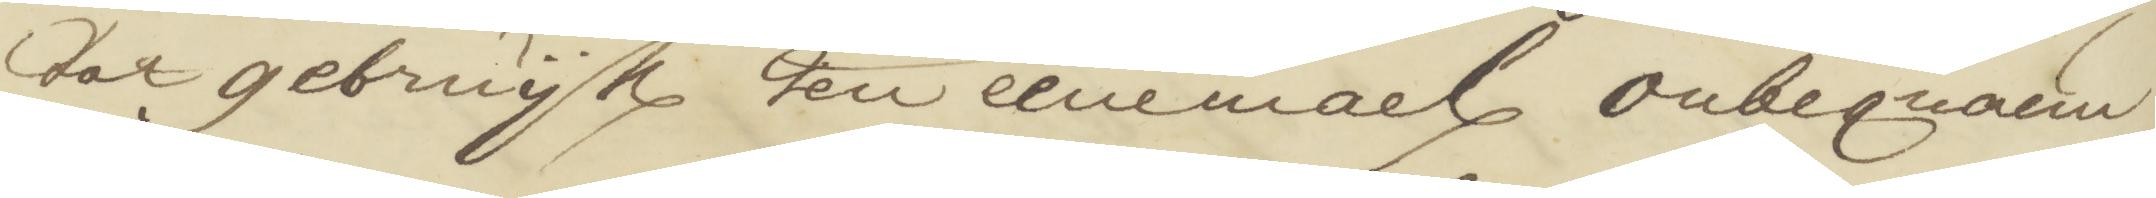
dat gebruijk ten eenemael onbequaem
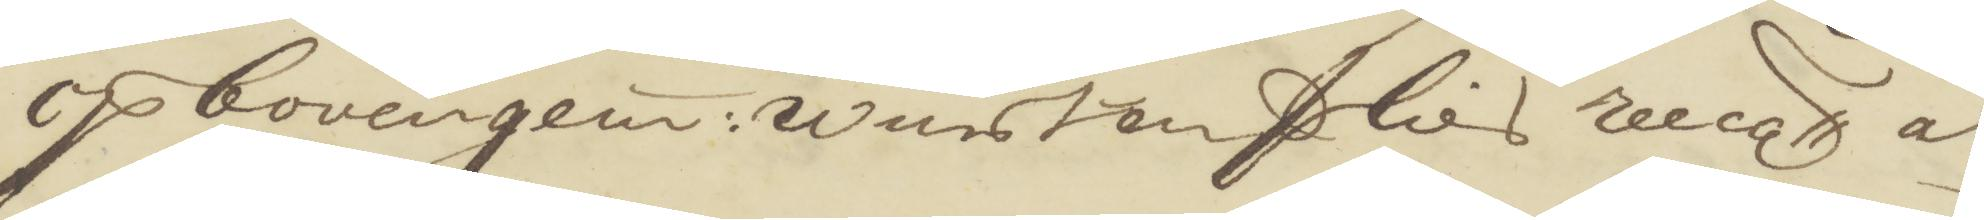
op bovengem: winst en Verlies reecq=' al
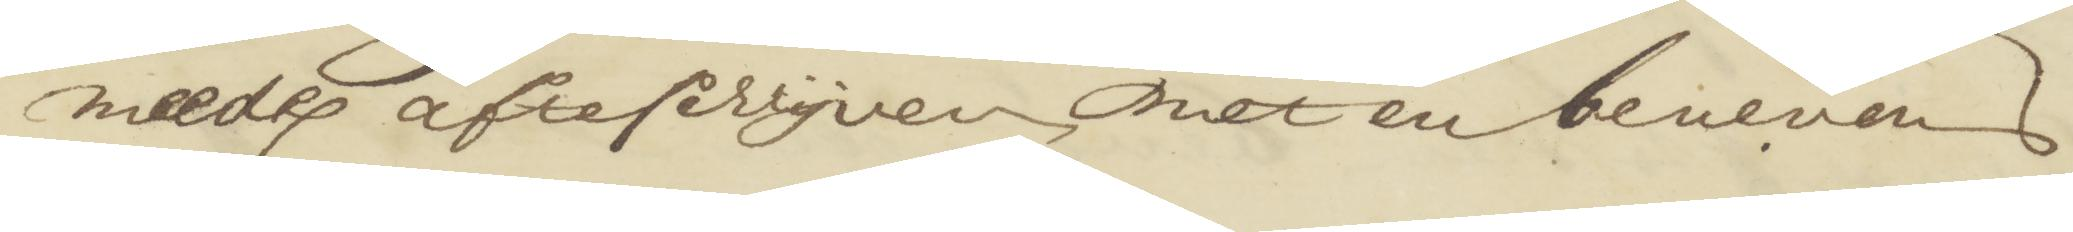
meede af te schrijven met en benevens
